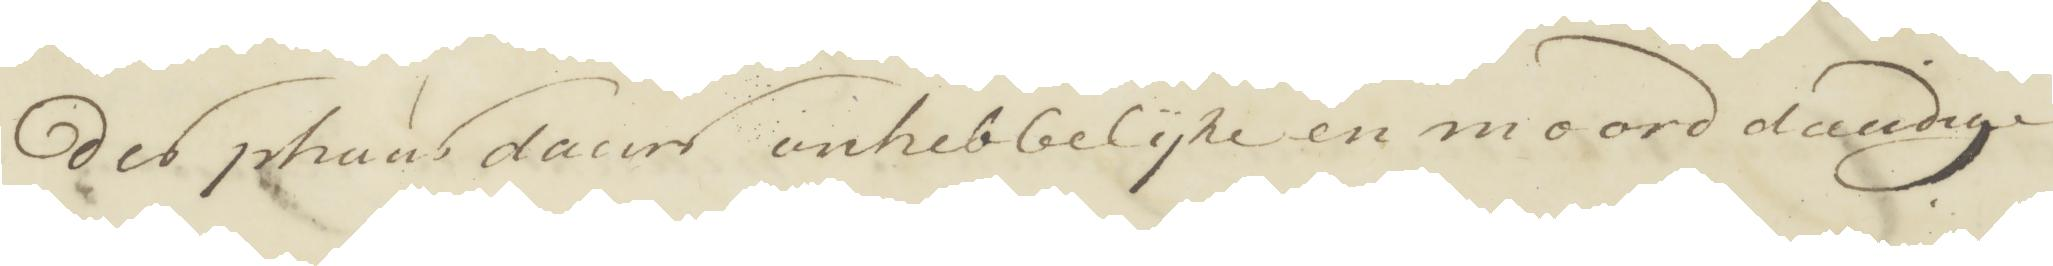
des phaus daars onhebbelijke en moord daadige
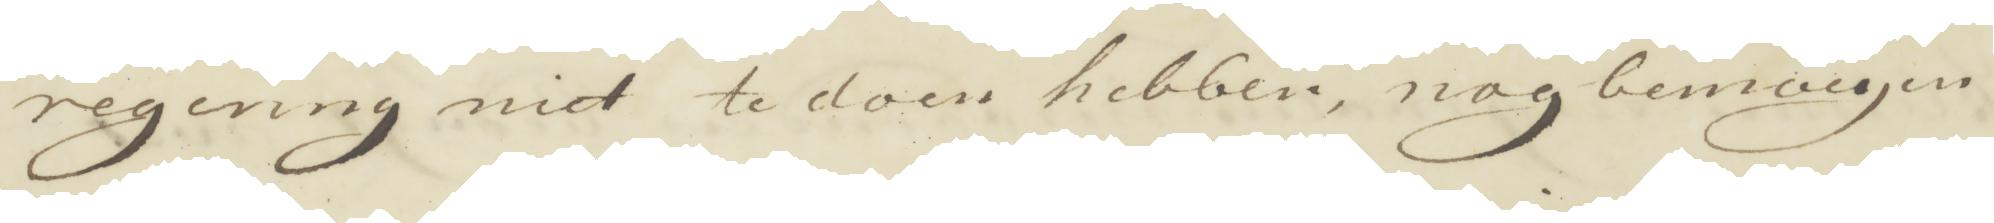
regering niet te doen hebben, nog bemoeyen
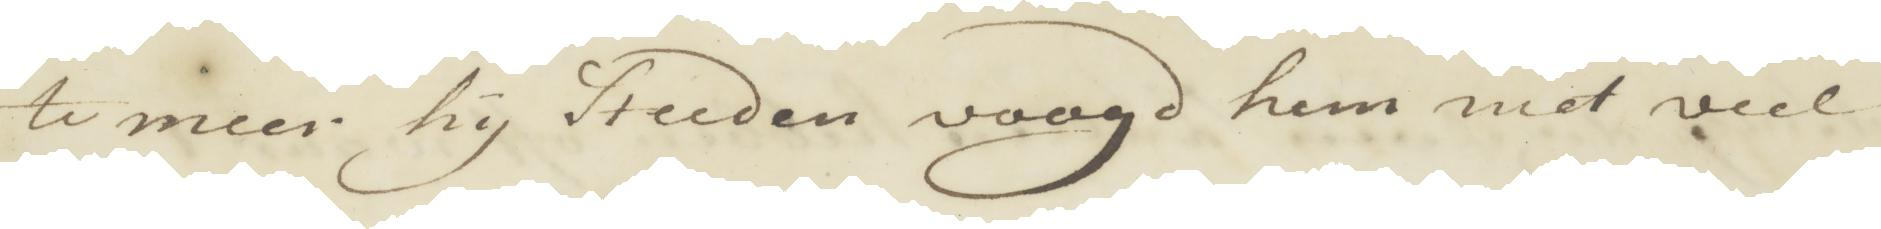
te meer hij steeden voogd hem niet veel
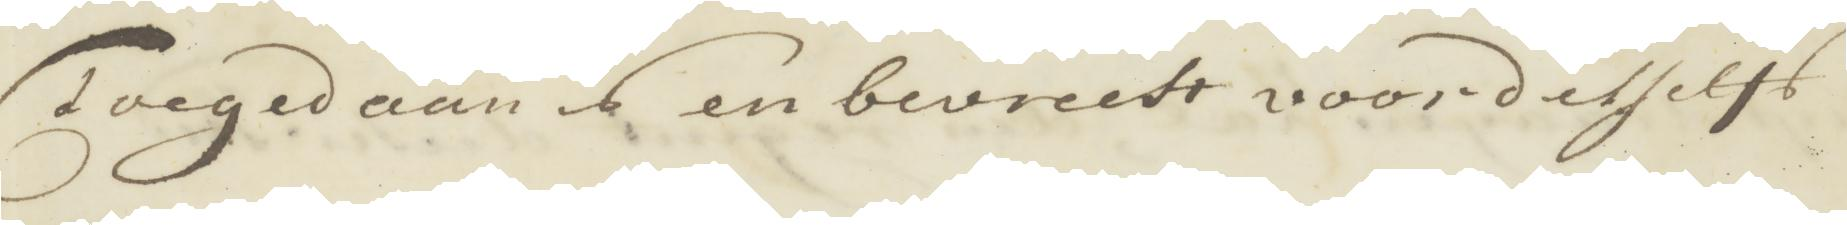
Toegedaan is en bevreest voor desselfs
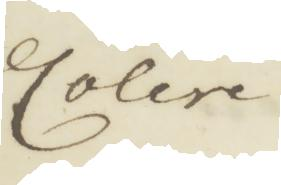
Colere
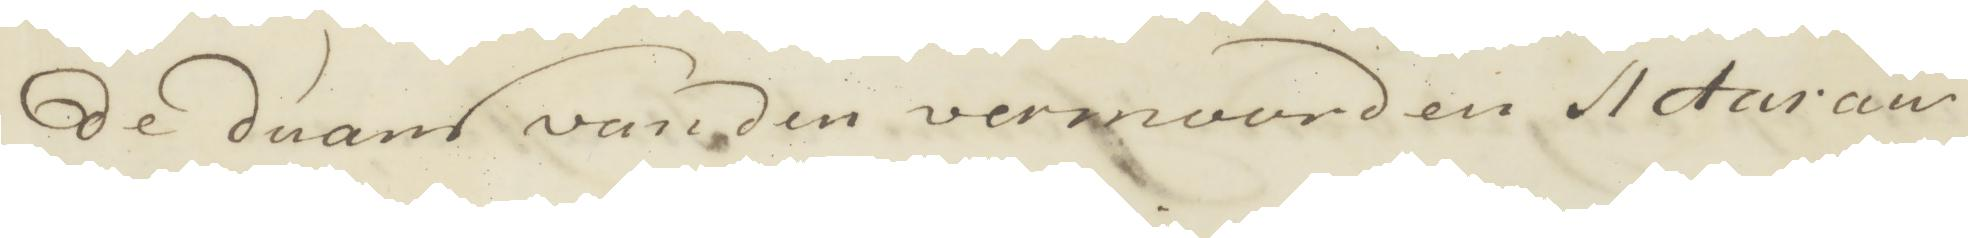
de duans van den vermoorden Actarau
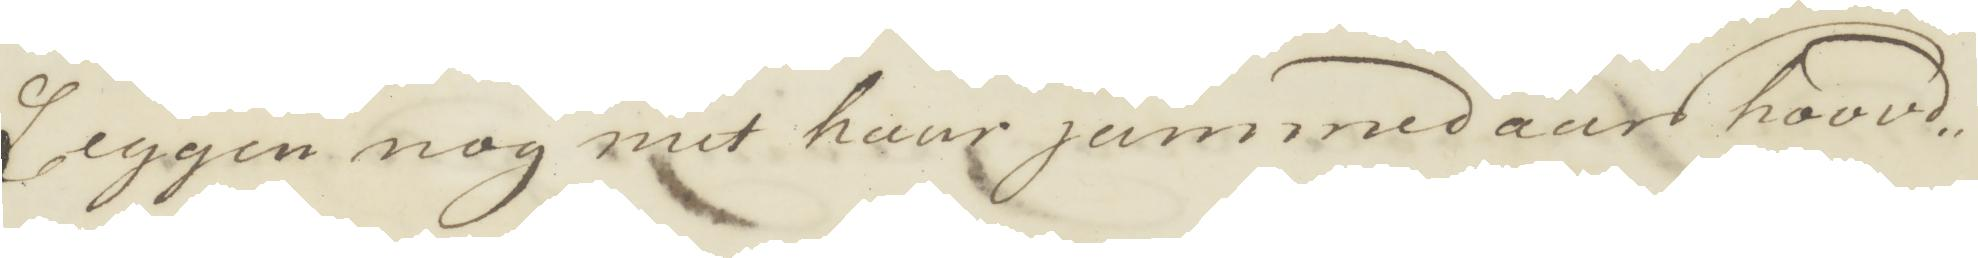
Leggen nog met haar jammedaars hoovd„
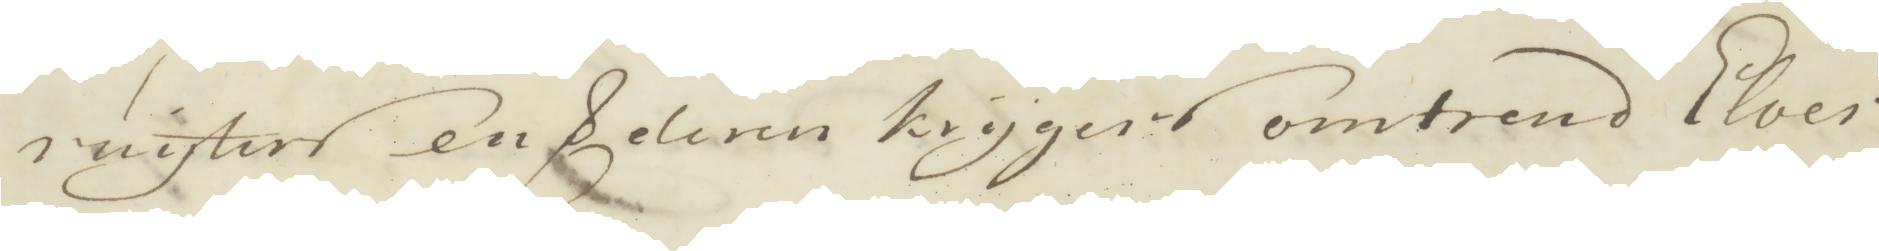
ruijters en verderen krijgers omtrend Eloer
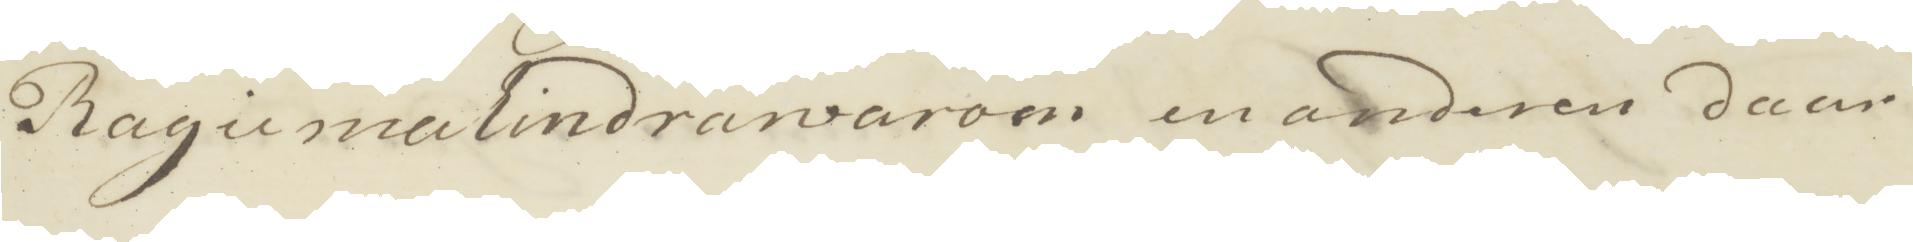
Ragiemahindrawaroen en anderen daar
